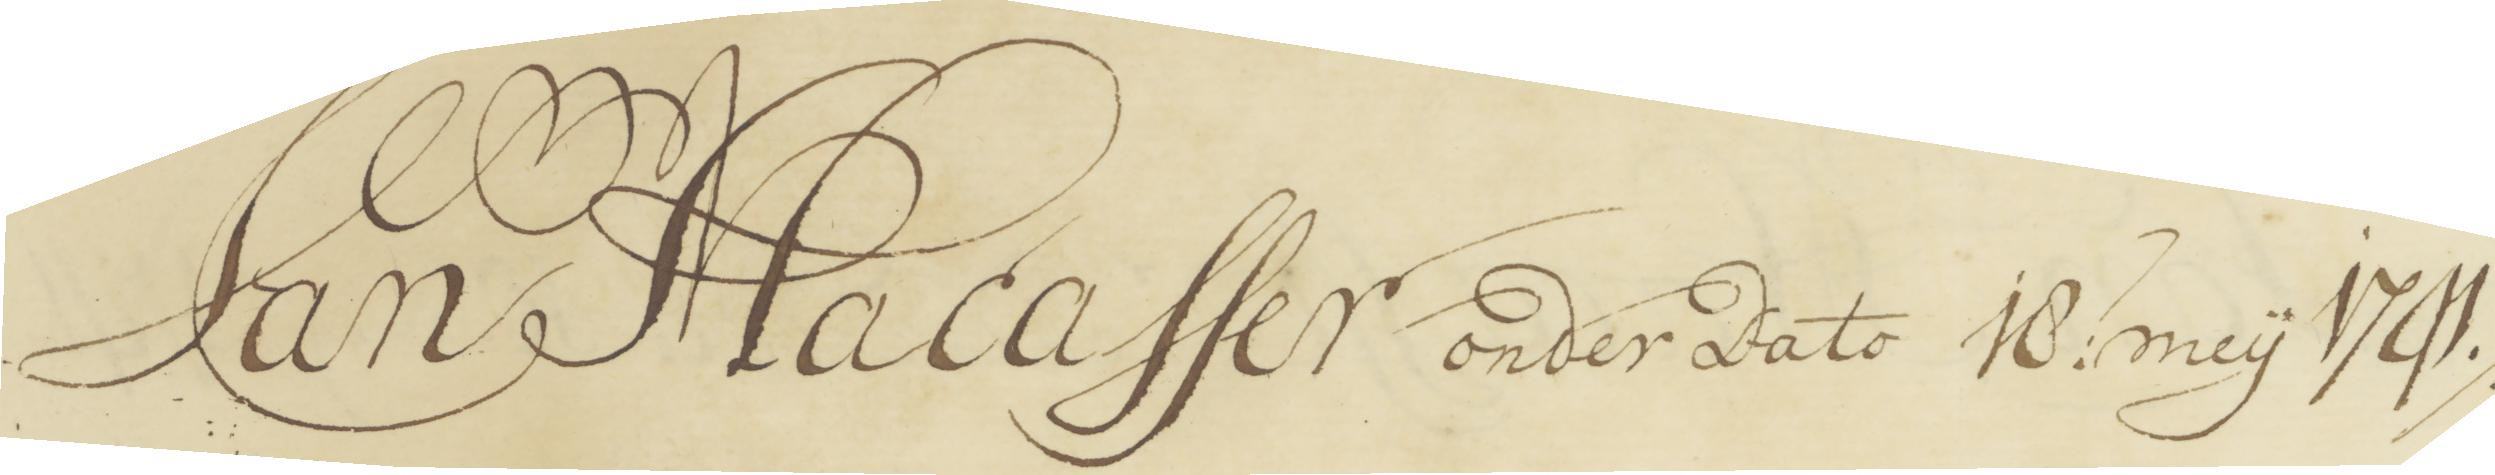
Van Macasser onder Dato 18:' meij 1741./.
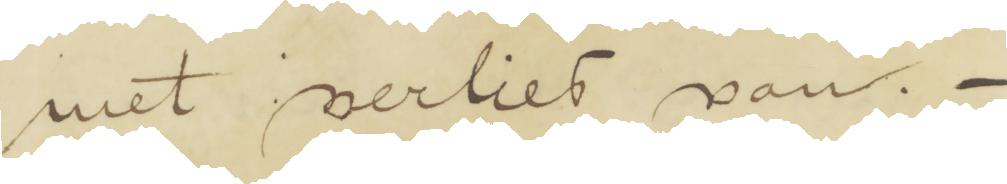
met verlies van. -
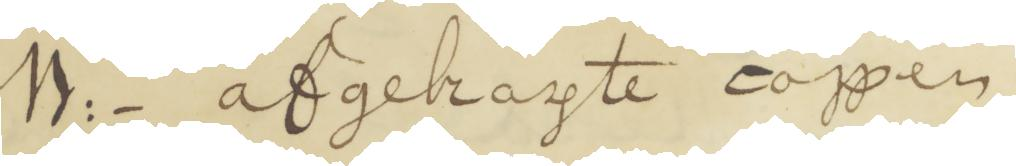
11:- afgekapte coppen
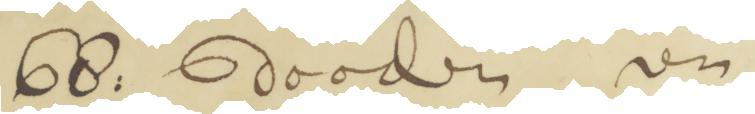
68: dooden en
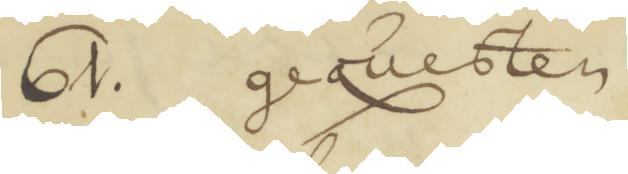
61. gequesten
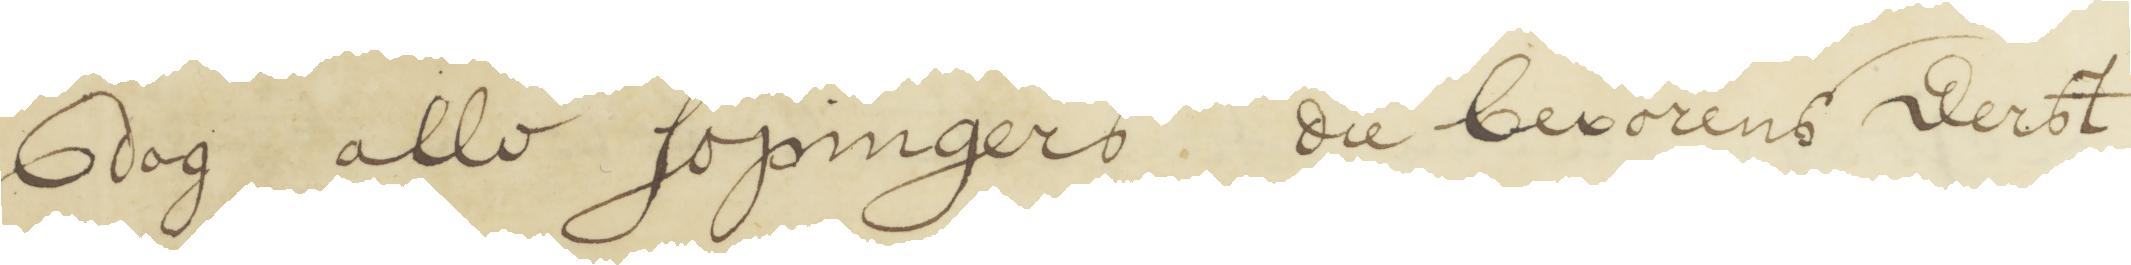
dog alle sopingers die bevorens Eerst
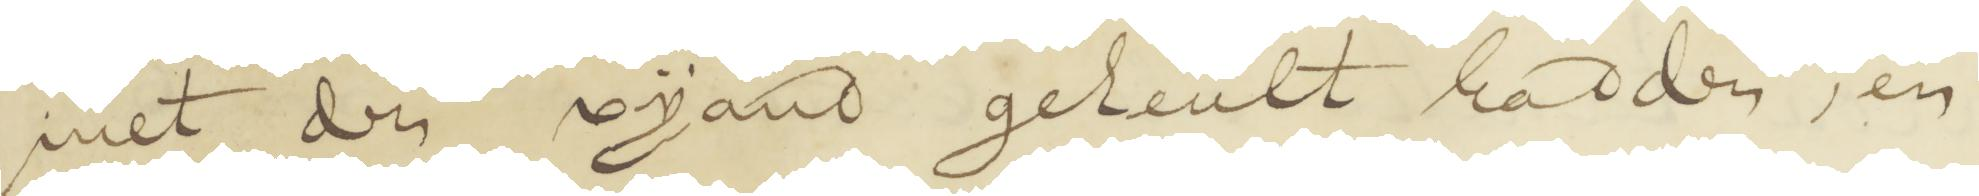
met den vijand geheult hadden, en
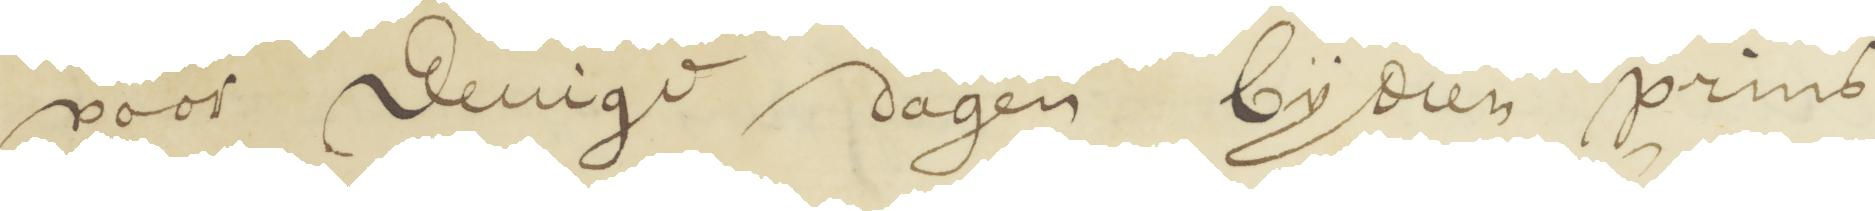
voor Eenige dagen bij dien prins
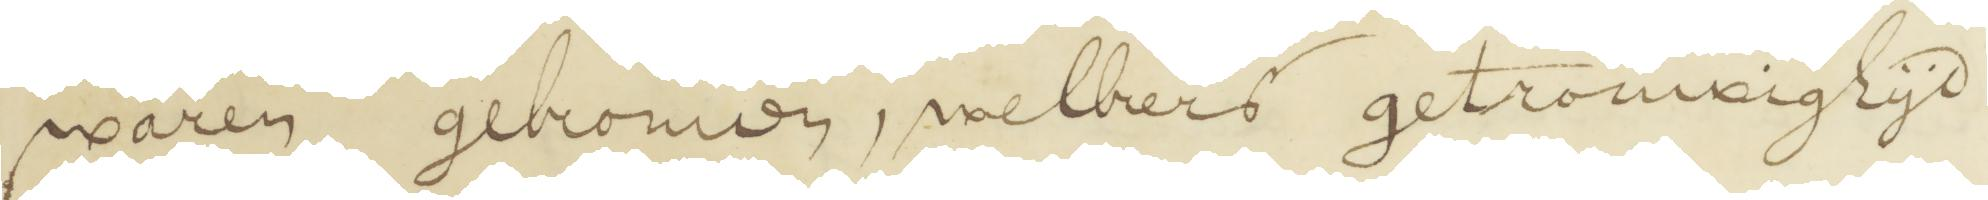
waren gekomen, welkers getrouwighijd
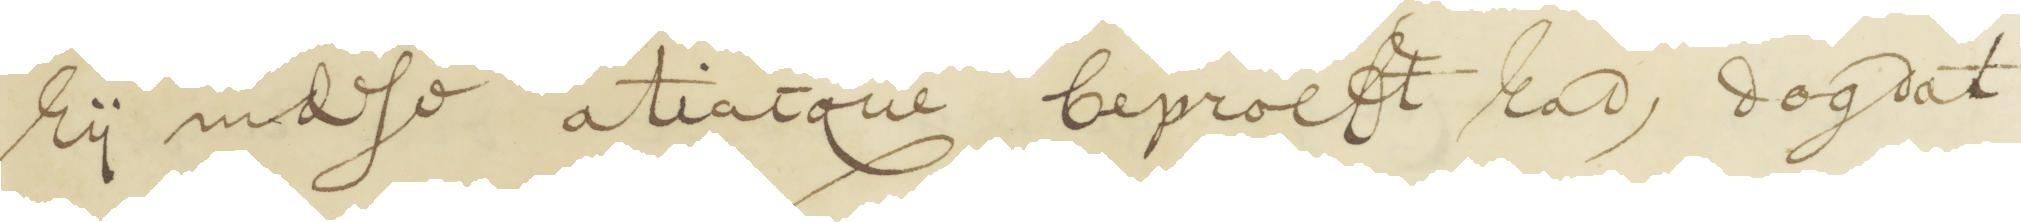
hij in dese atiacque beproeft had, dog dat
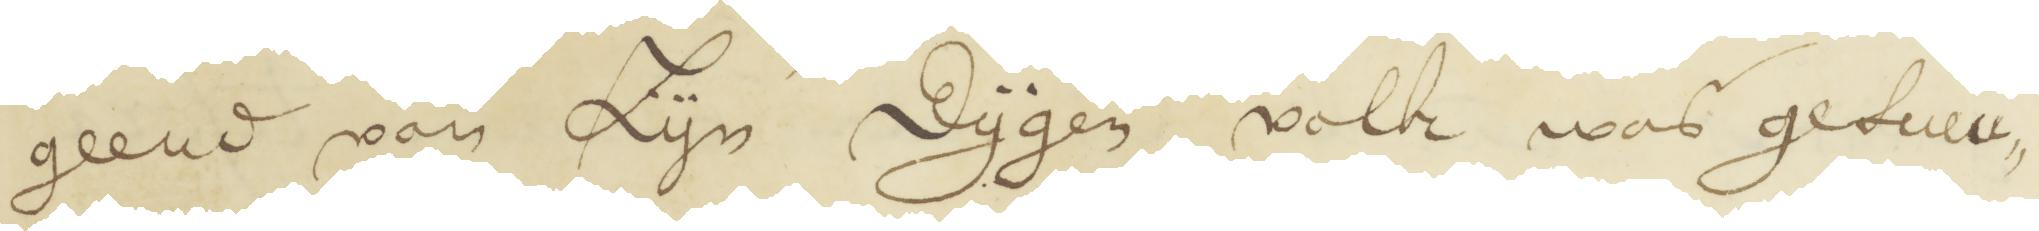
geene van zijn Eijgen volk was gesneu„
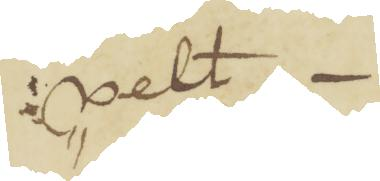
„velt; -
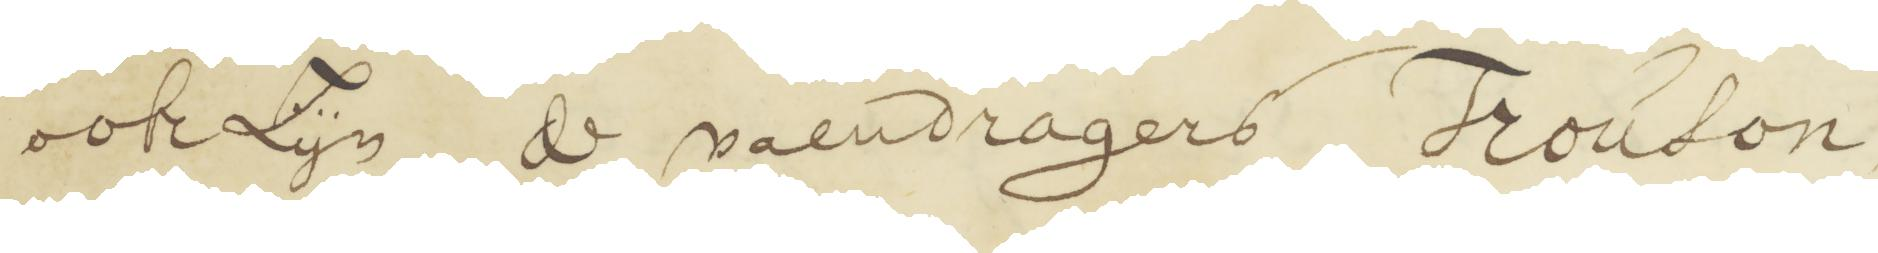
ook zijn de vaendragers Trouson„
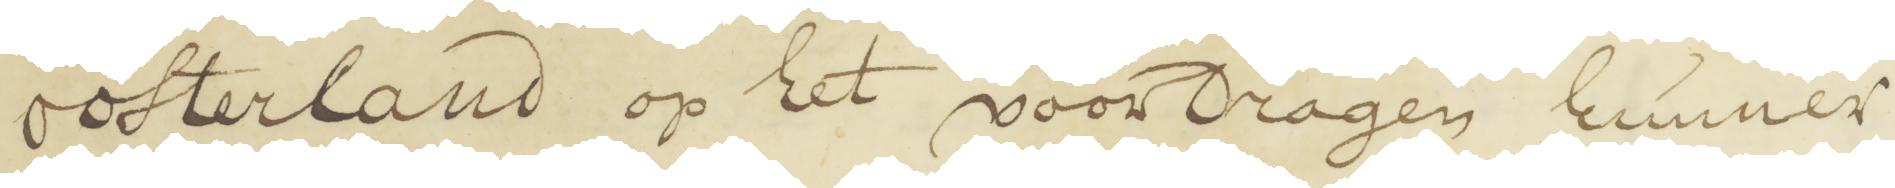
oosterland op het voordragen hunner
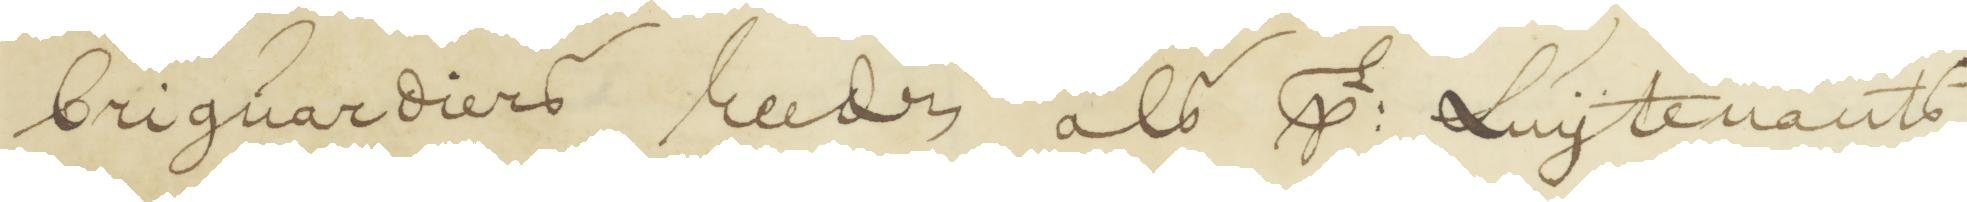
briguardiers heeden als p:l Luijtenants
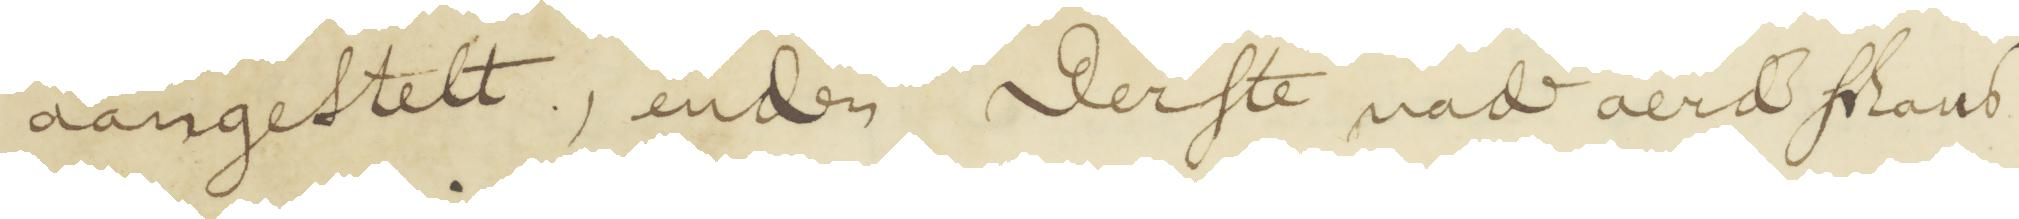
aangestelt., enden Eerste nade aerde schans
